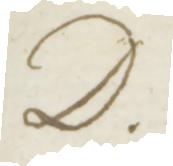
D.
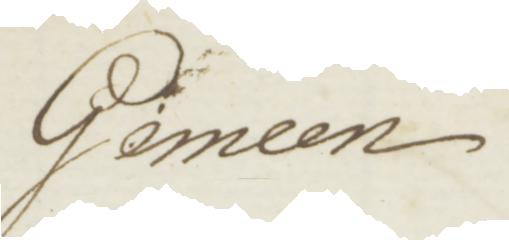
Gemeen
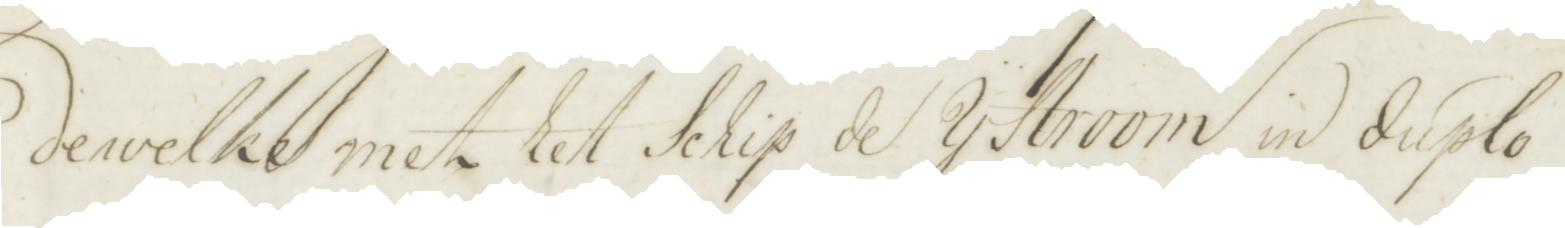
de welke met het schip de IJstroom in duplo
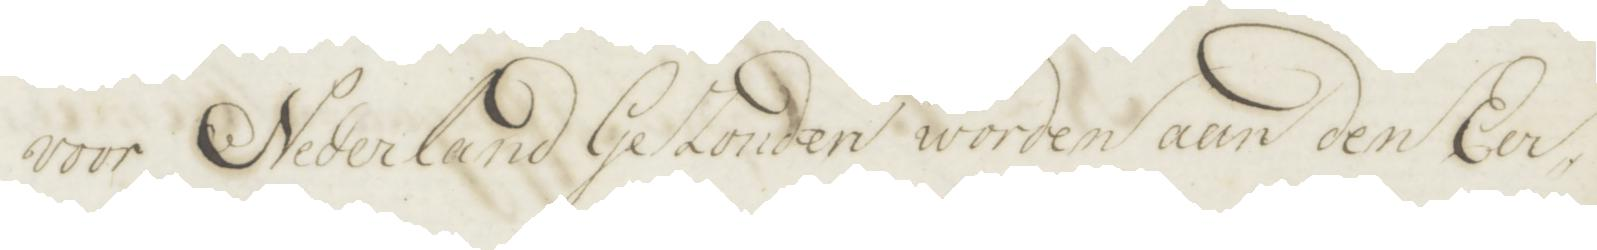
voor Neerland Gezonden worden aan den Eer„
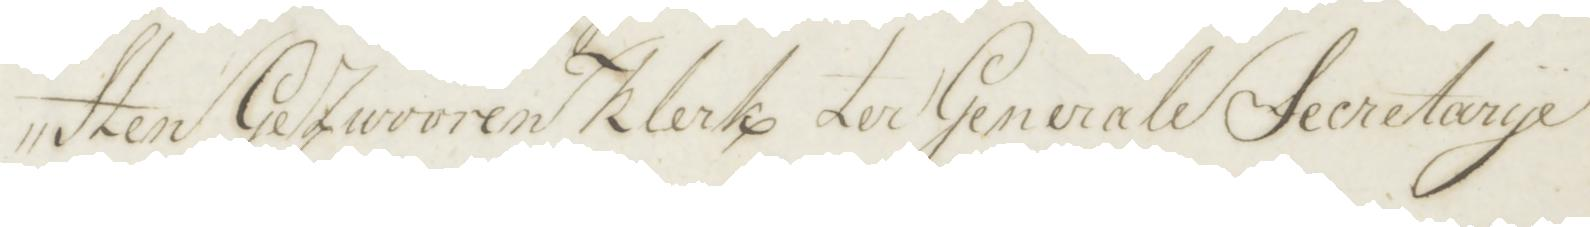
„Sten Gezwooren Klerk tor Generale Secretarije
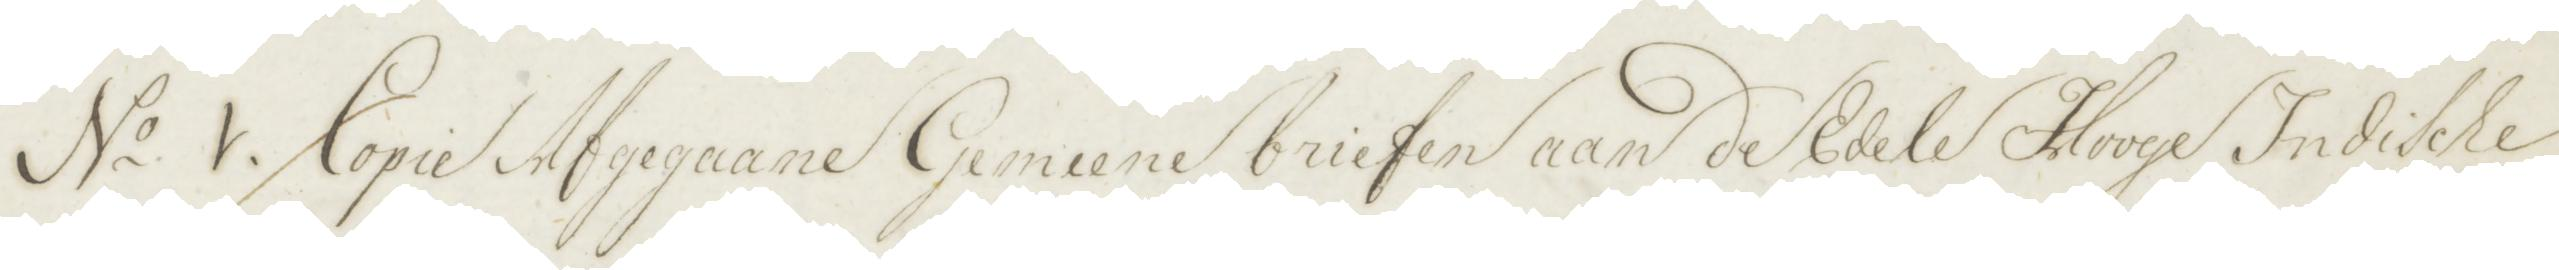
No 1. Copie Afgegaane Gemeene briefen aan de Edele Hooge Indische
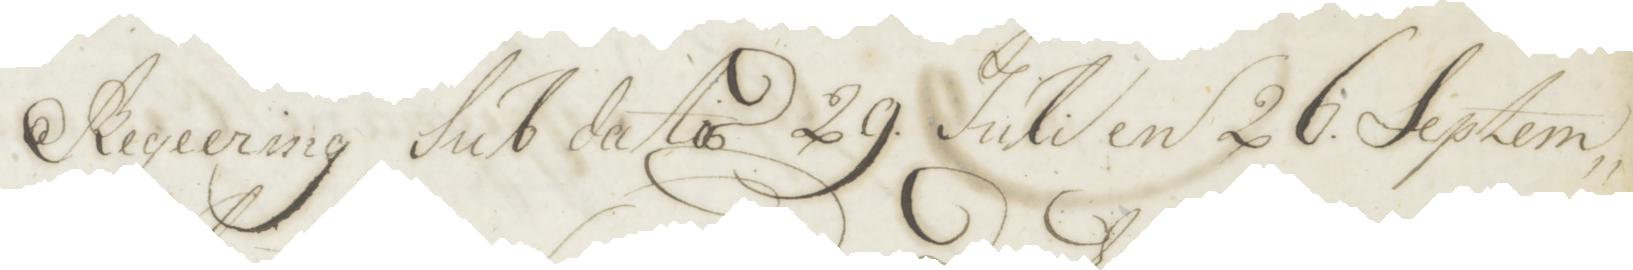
Regeering Sub datos 29 Iuli en 26. Septem„
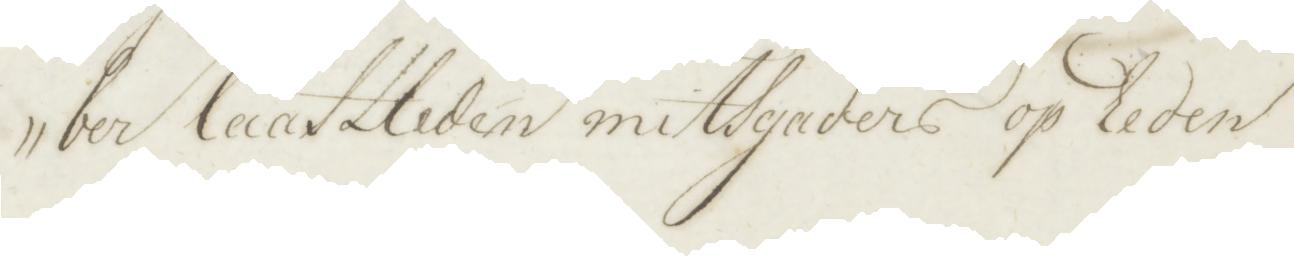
„ber laastleden mitsgaders op heden
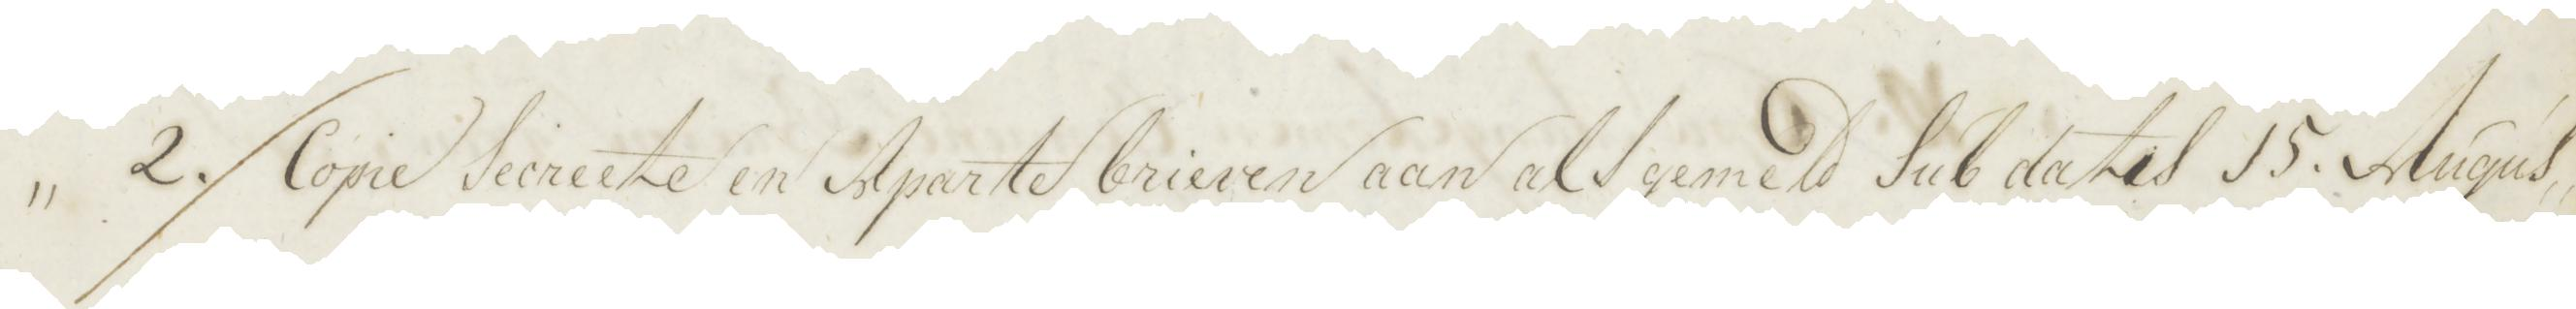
„ 2 ./ Copie Secreete en Aparte brieven aan als gemeld Sub datis 15. Augus„
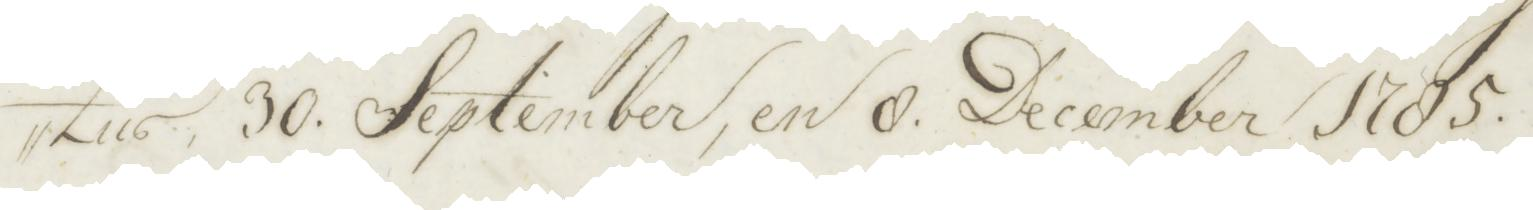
„tus, 30. September, en 8. December 1785.
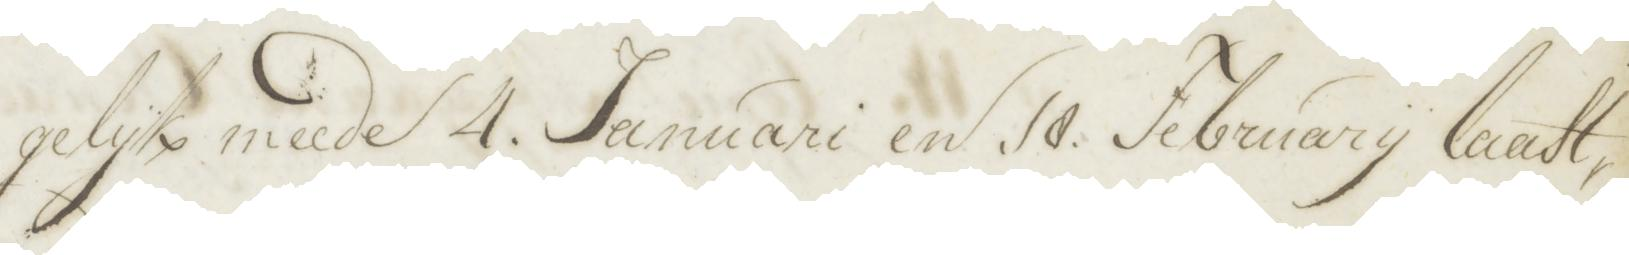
gelijk meede 4. Ianuari en 18: Februarij laast„
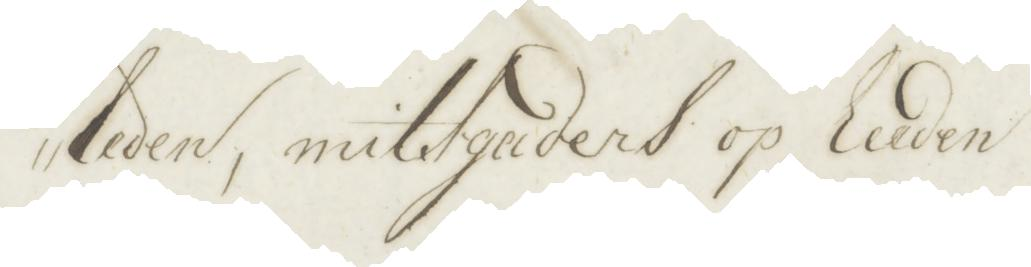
„leden, mitsgaders op heeden
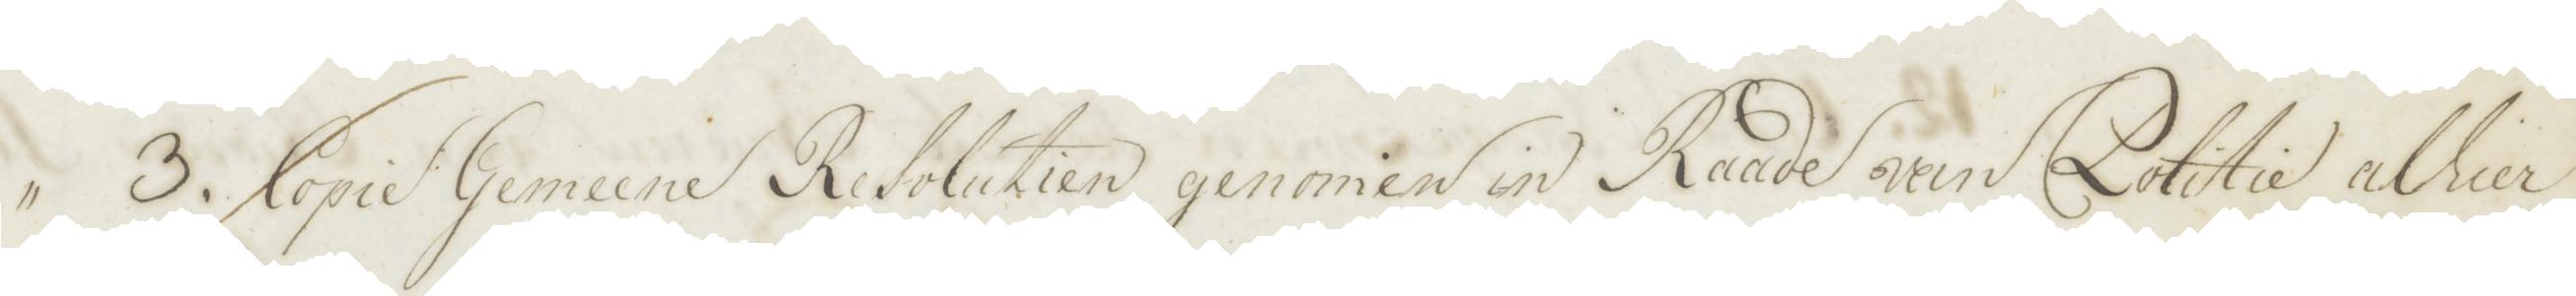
„ 3. /Copie Gemeene Resolutien genomen in Raade van Politie alhier
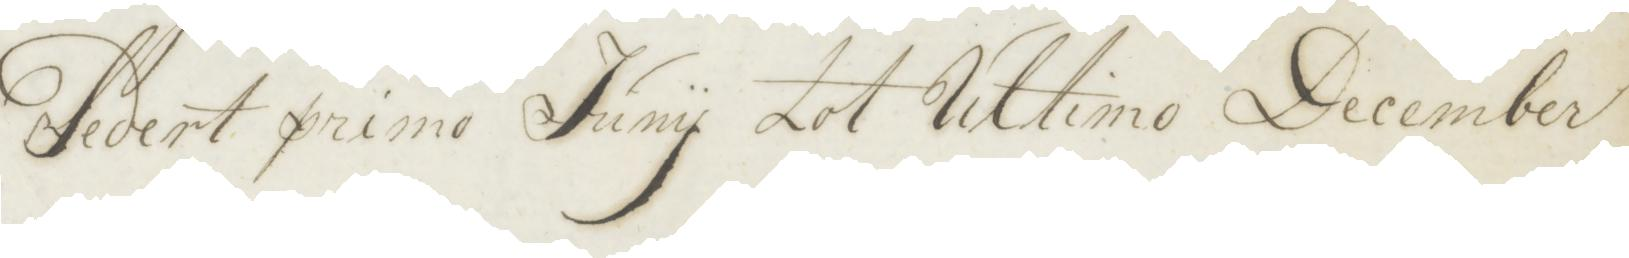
Sedert primo Iunij tot ultimo December
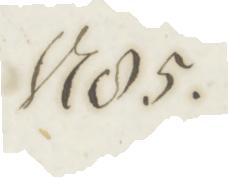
1785.
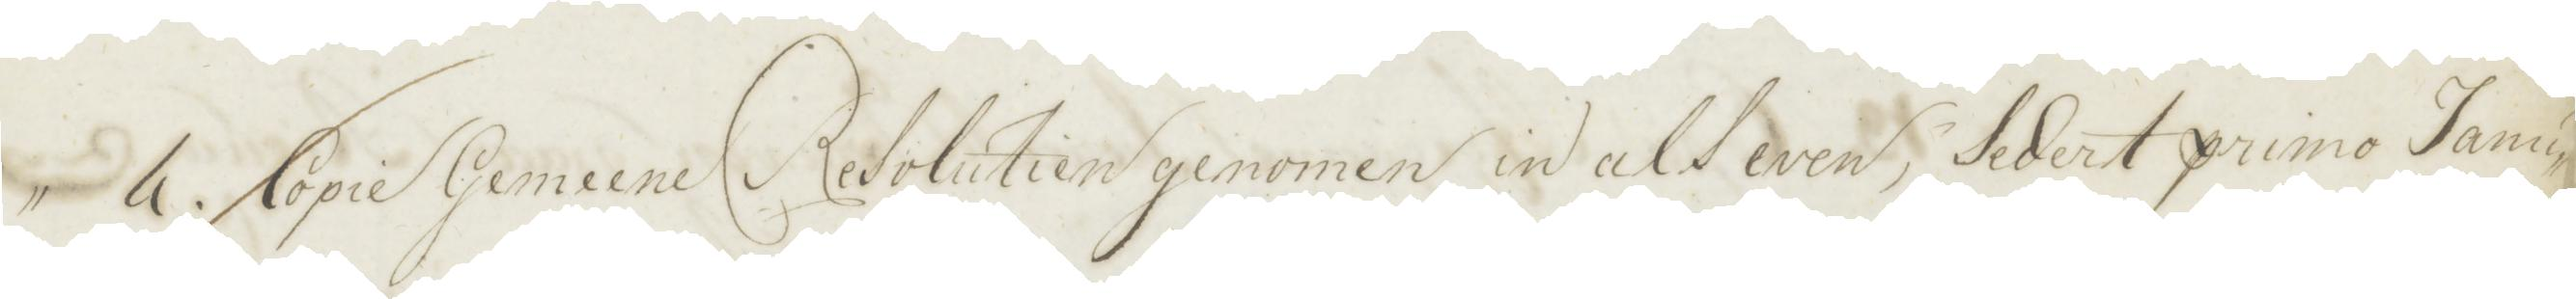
„ 4. /Copie Gemeene Resolutien genomen in als even, Sedert primo Ianu„
